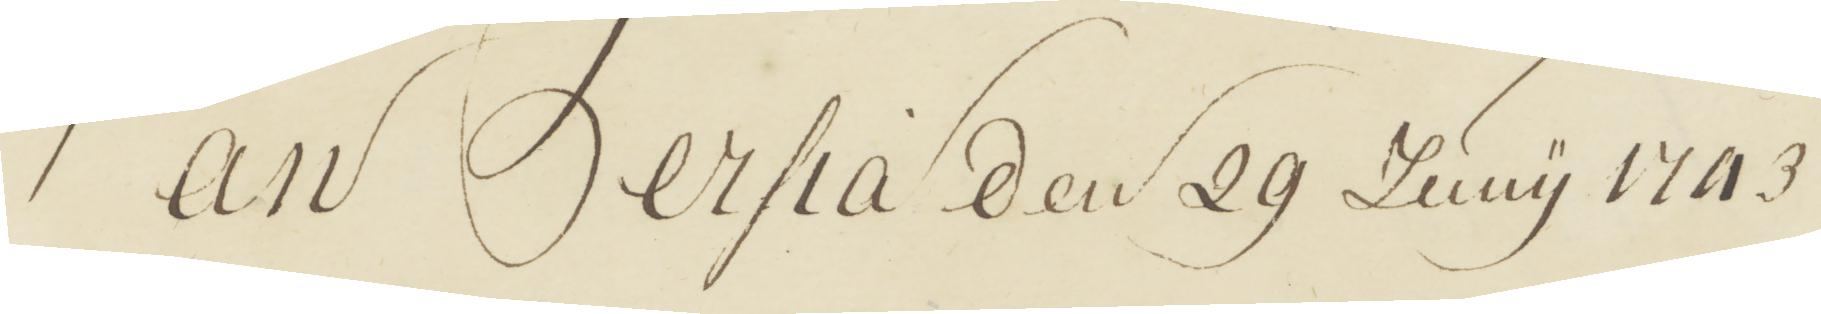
Van Persia den 29 Junij 1743
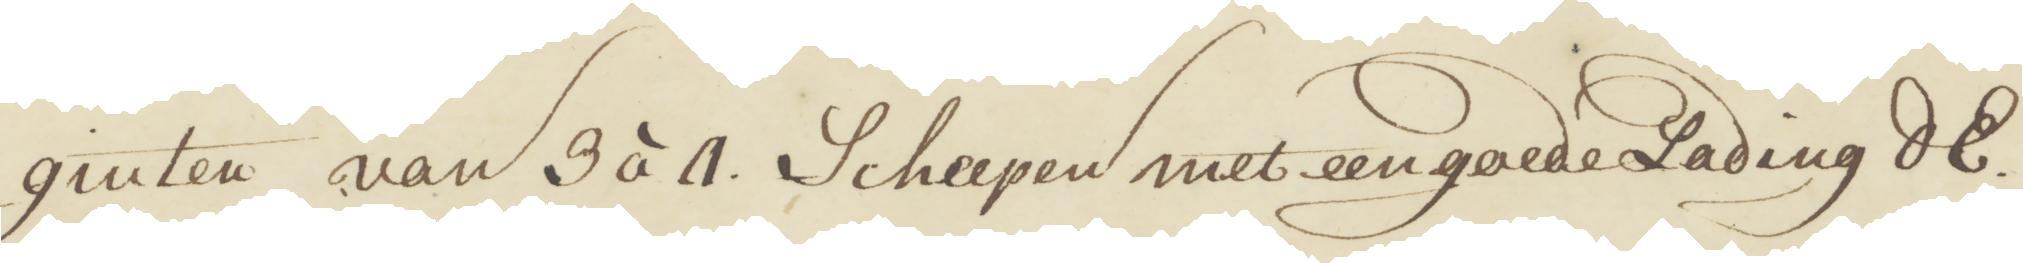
ginter van 3 à 4. scheepen met een goede Lading dE.
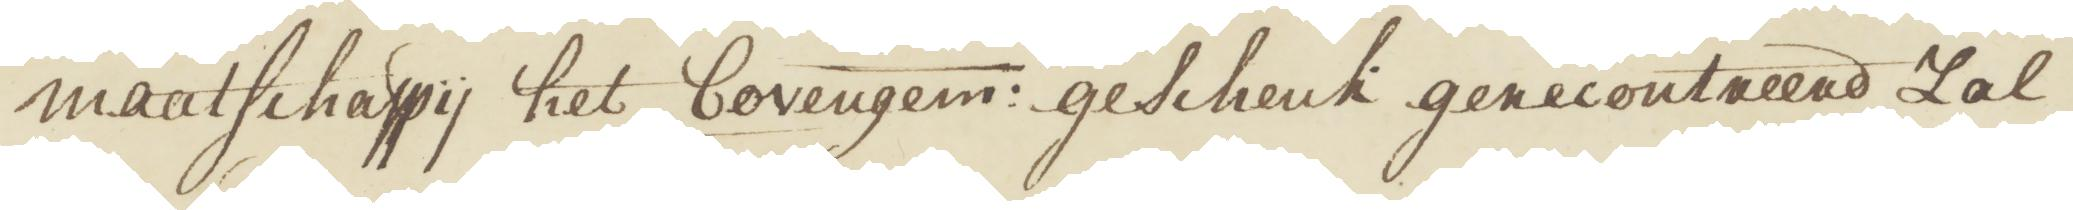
maatschappij het bovengem: geschenk gerecontreerd zal
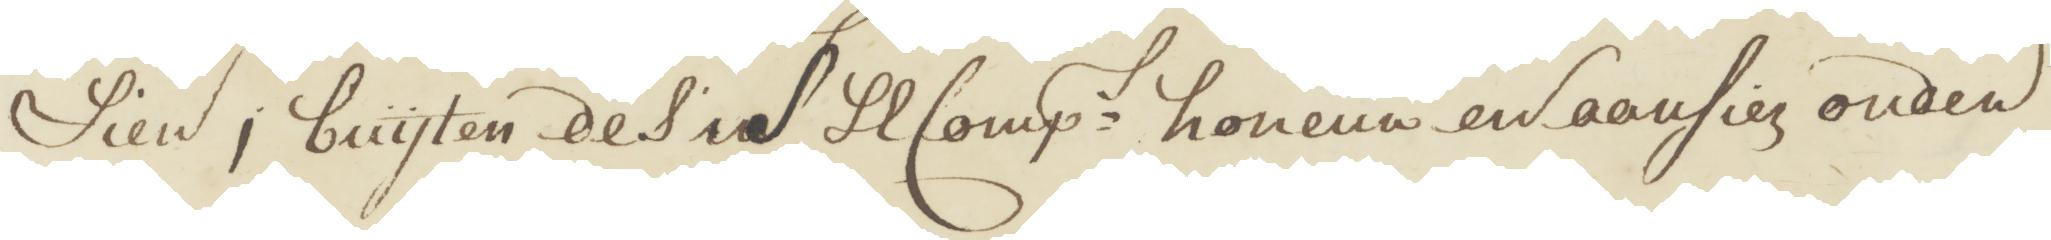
sien; buijten des is sEComp=s honeur en aansien onder
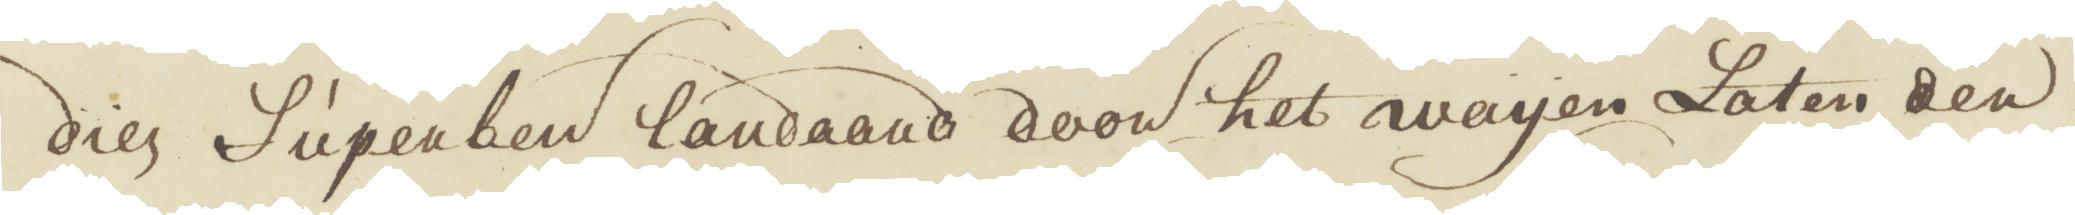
dien superben landaard door het waijen Laten der
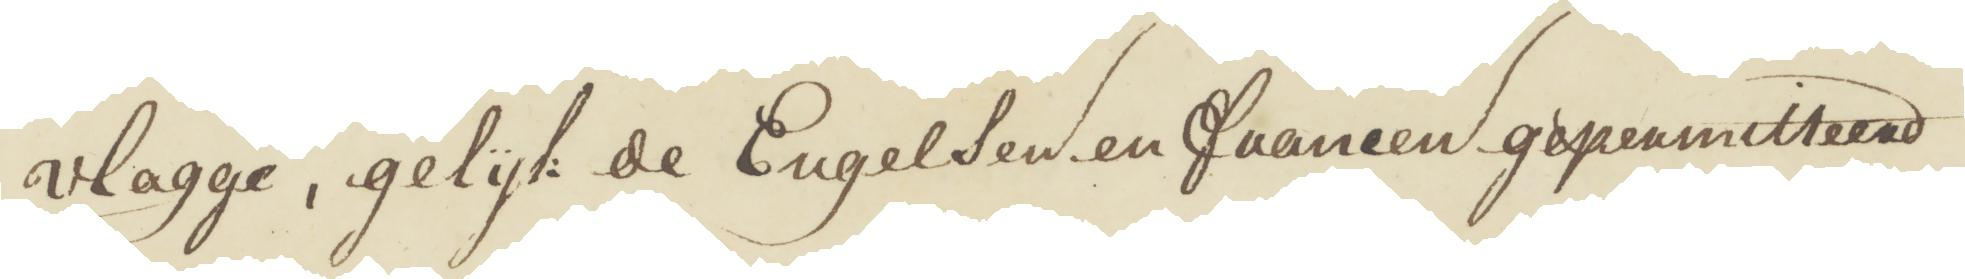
vlagge, gelijk de Engelsen en francen gepermitteerd
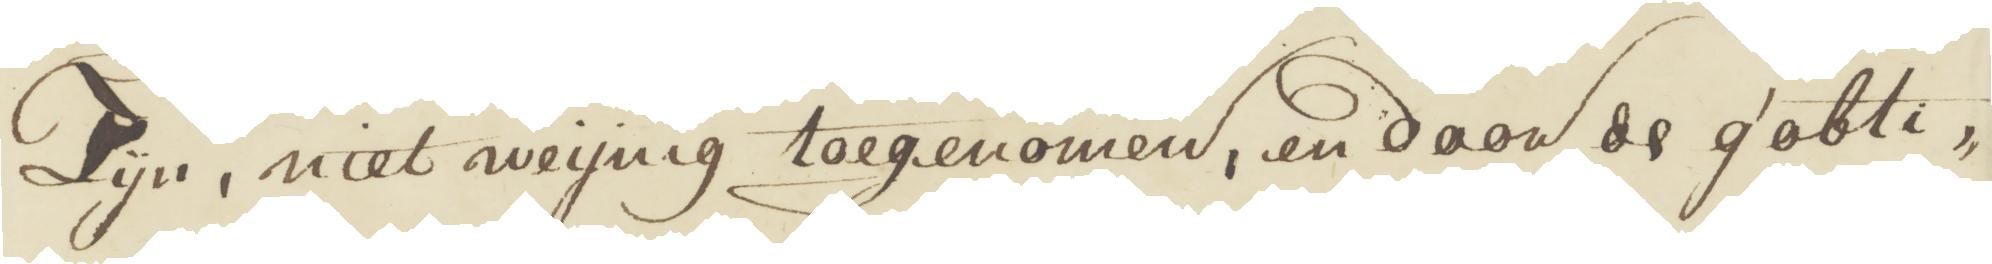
zijn, niet weijnig toegenomen, en door de g’obti„
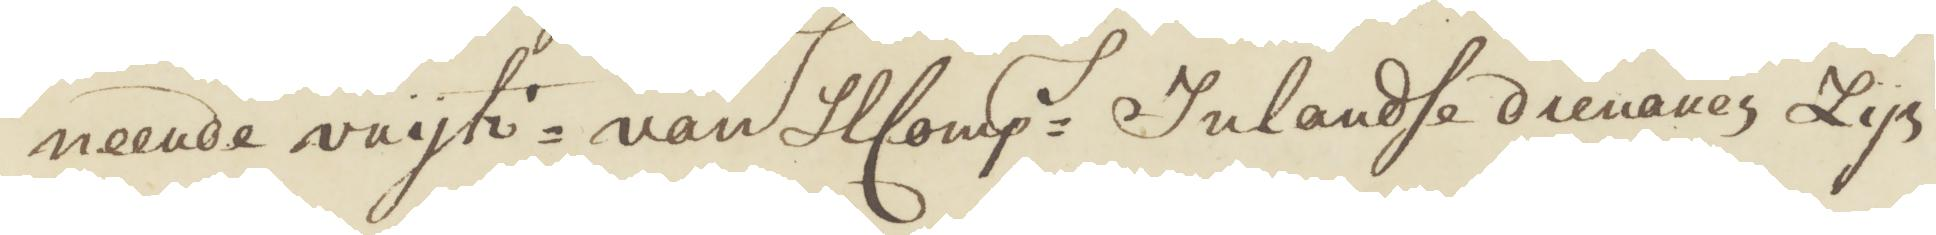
neerde vrijh=t van sEComp=s Inlandse dienaren zijn
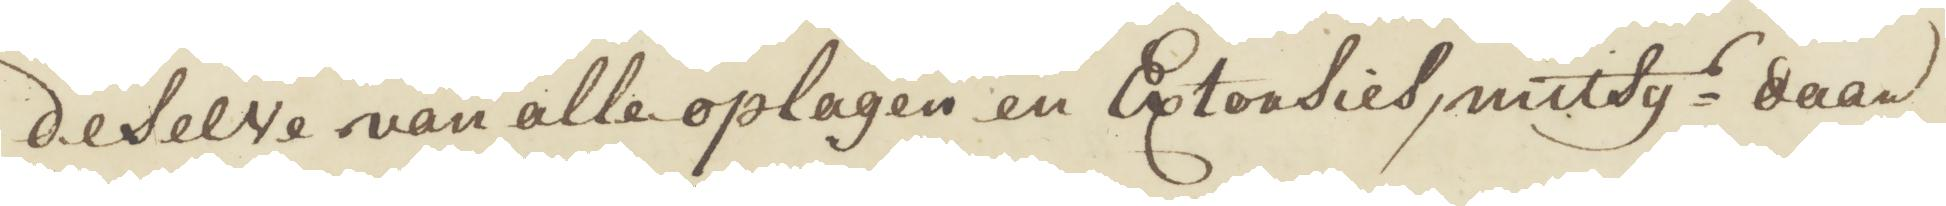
deselve van alle oplagen en Extorsies, mitsg=s daar
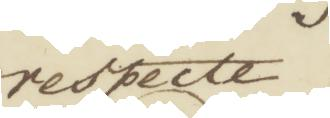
respecte
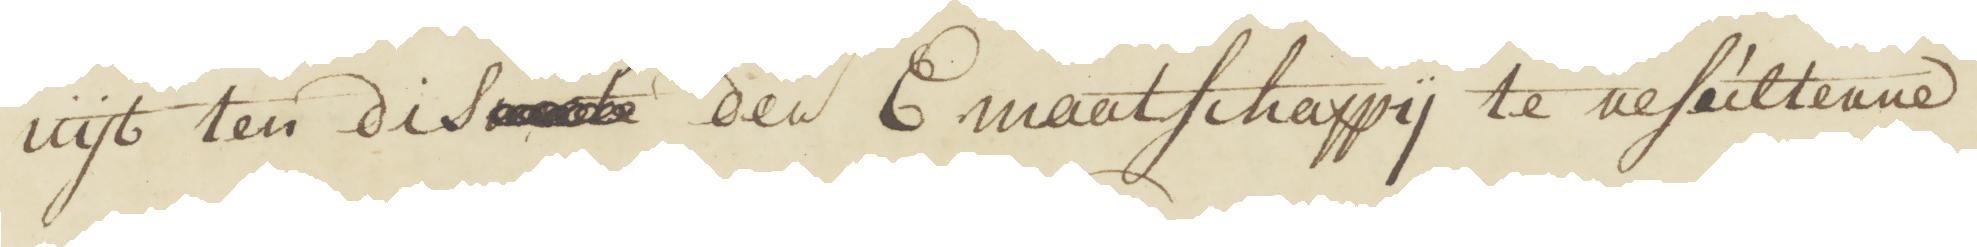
uijt ten discrete der E maatschappij te resulterne
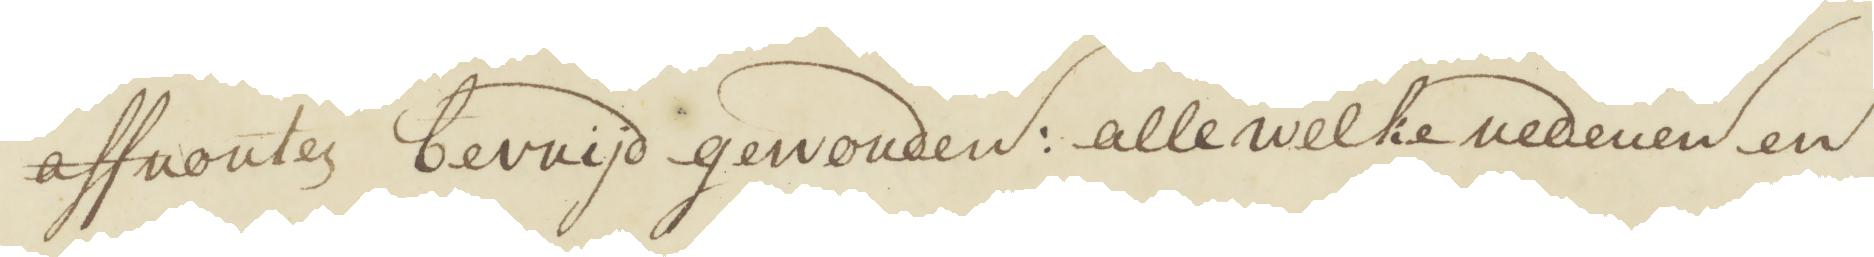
affronten bevrijd geworden: alle welke redenen en
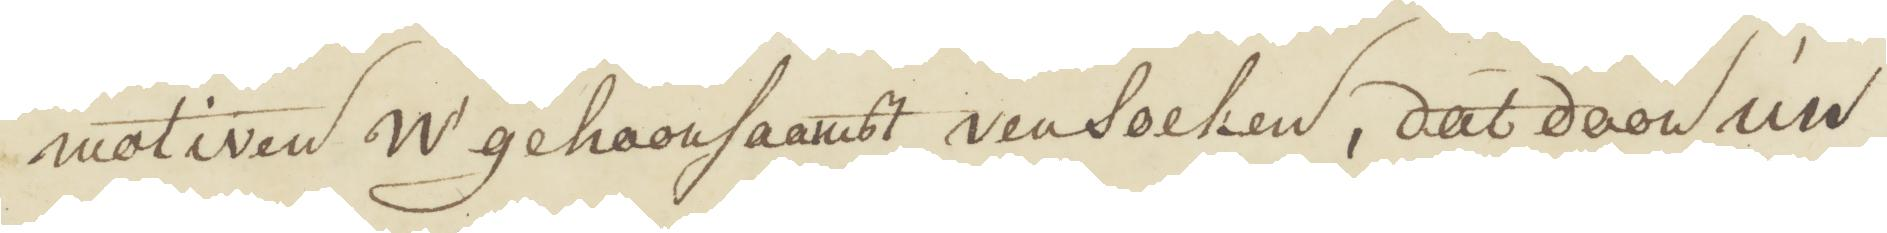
motiven w' gehoorsaamst versoeken, dat door uw
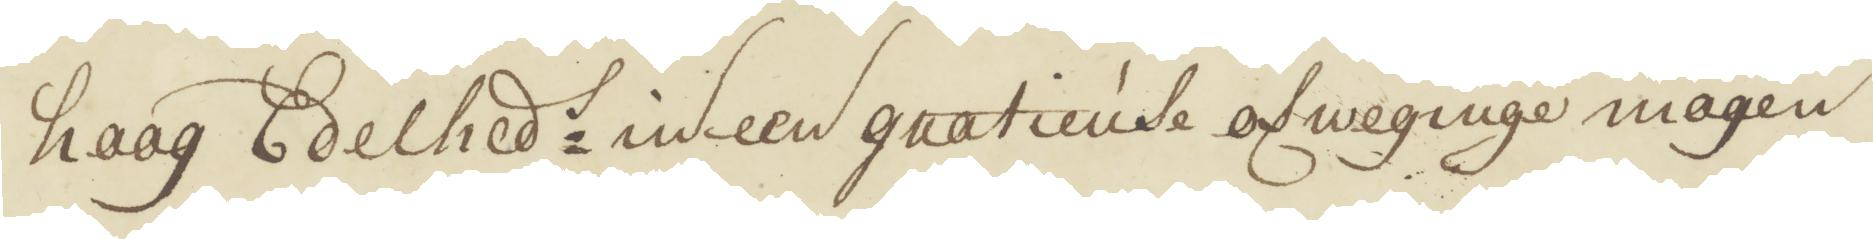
hoog Edelhed=s in een gratieuse overweginge mogen
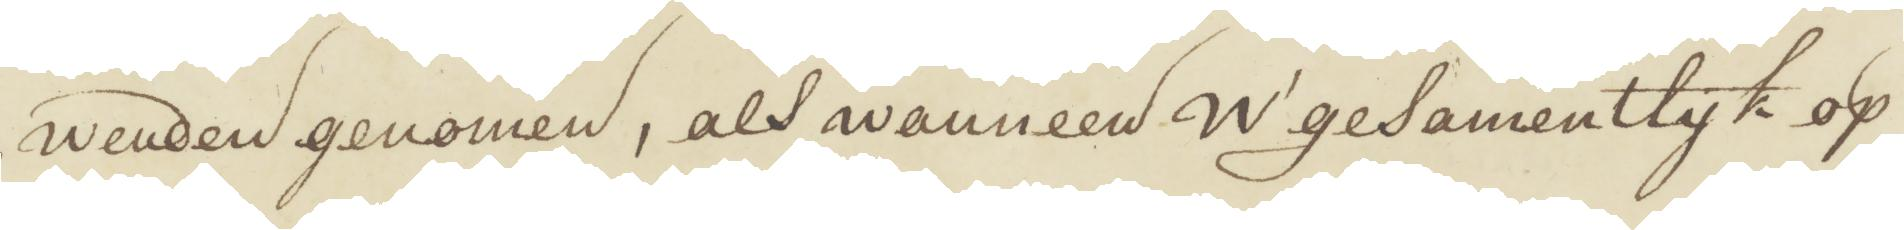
werden genomen, als wanneer w' gesamentlijk op
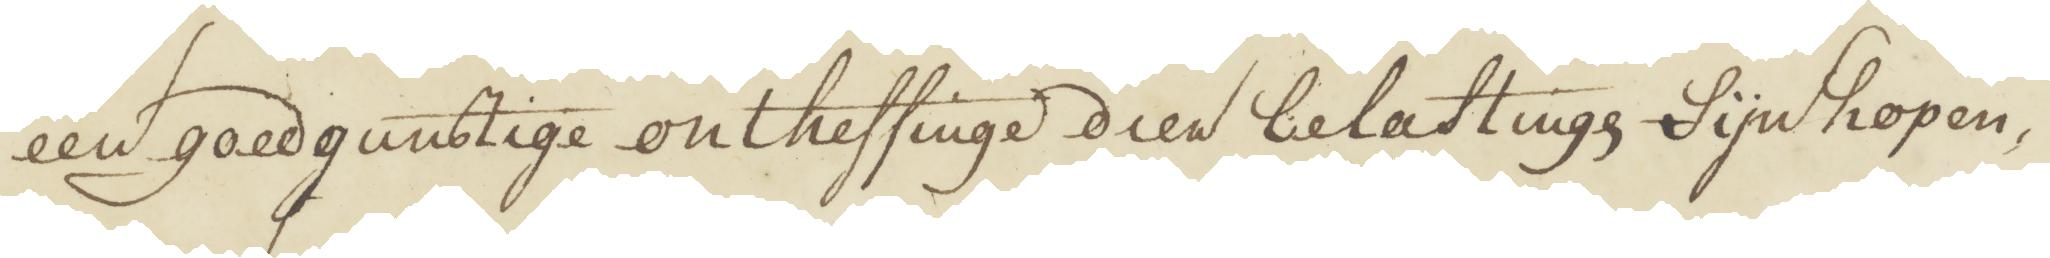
een goedgunstige ontheffinge dien belastingen sijn hopen„
